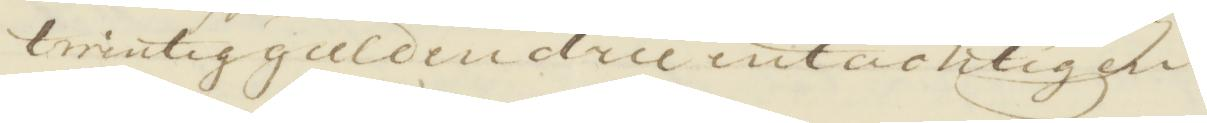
twintig gulden drie en tachtig en
